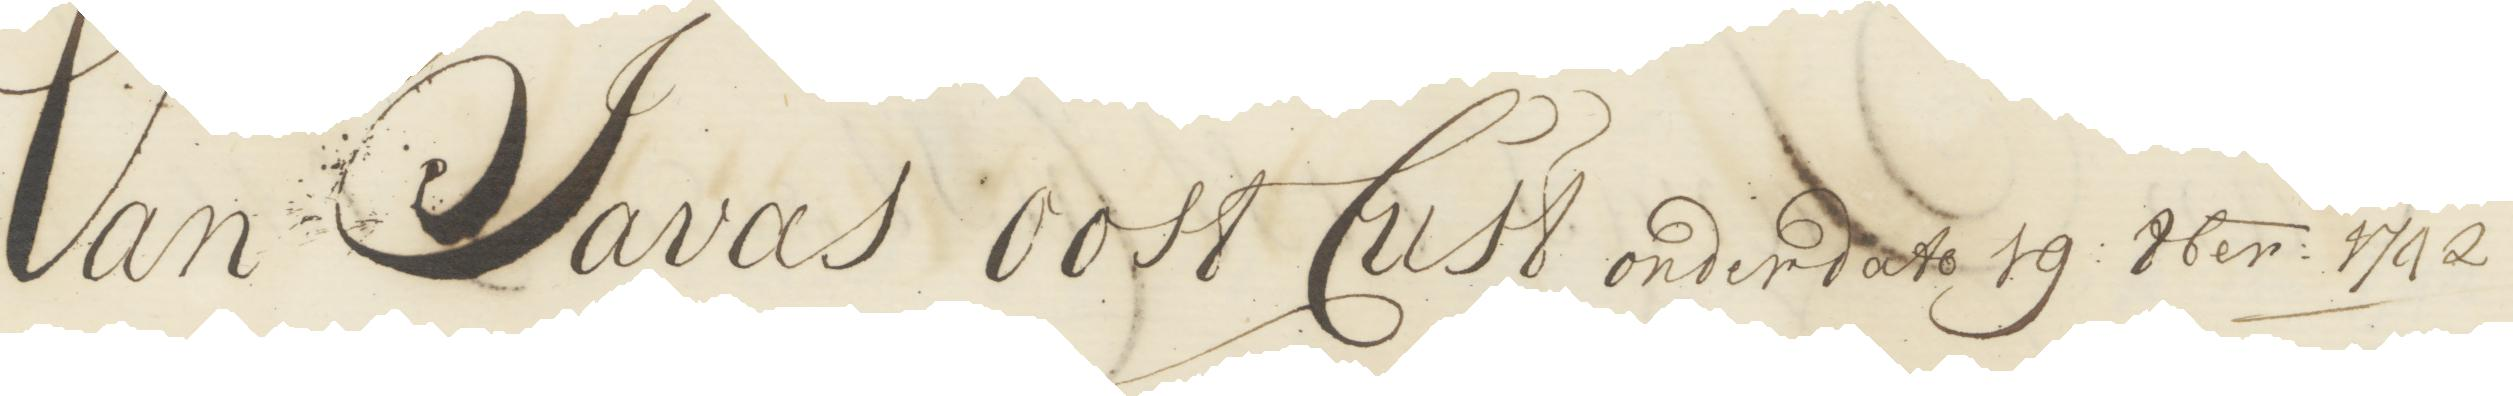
Van Javas oost Cust onder dato 19: 8ber: 1742
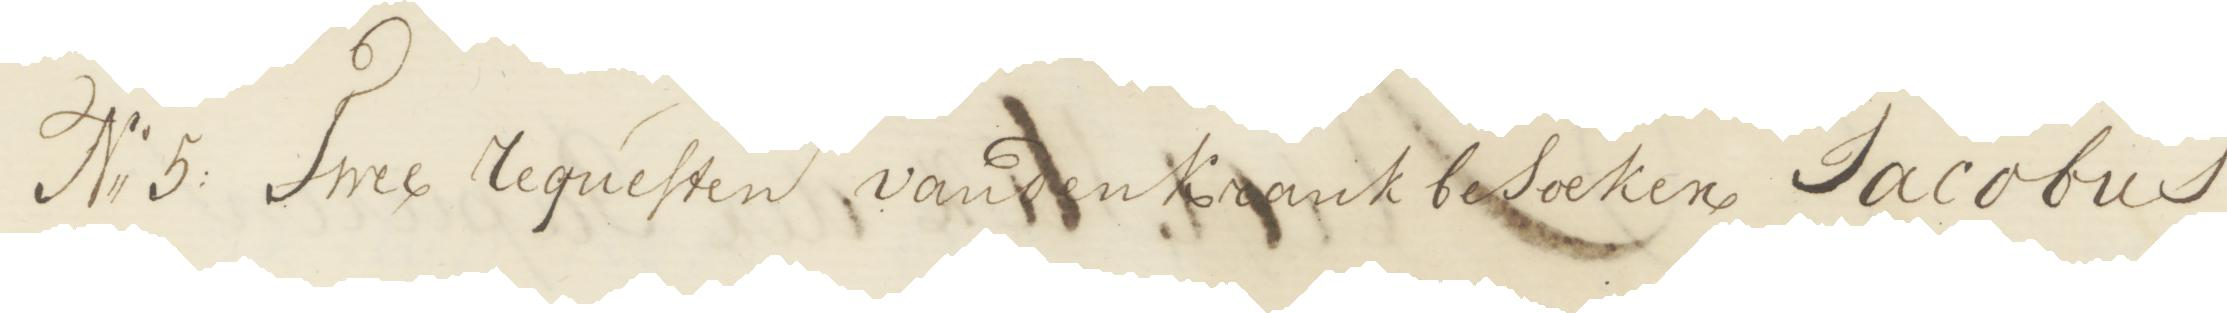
N„o 5: Twee requesten van den krank besoeker Jacobus
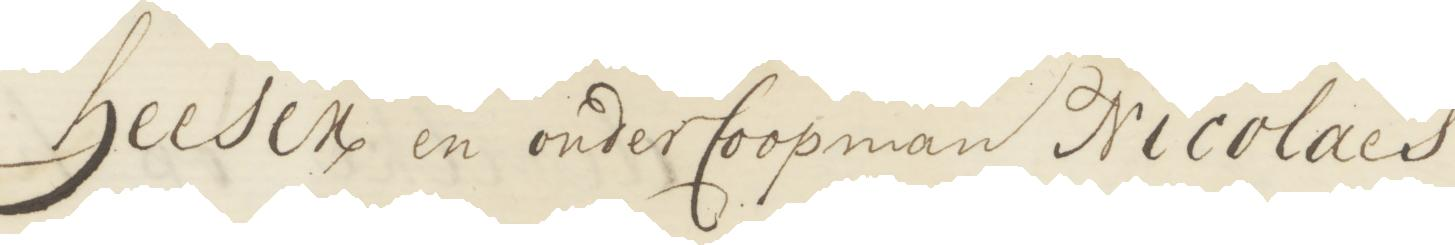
Heeser en ondercoopman Nicolaes
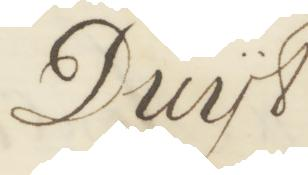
Duijt
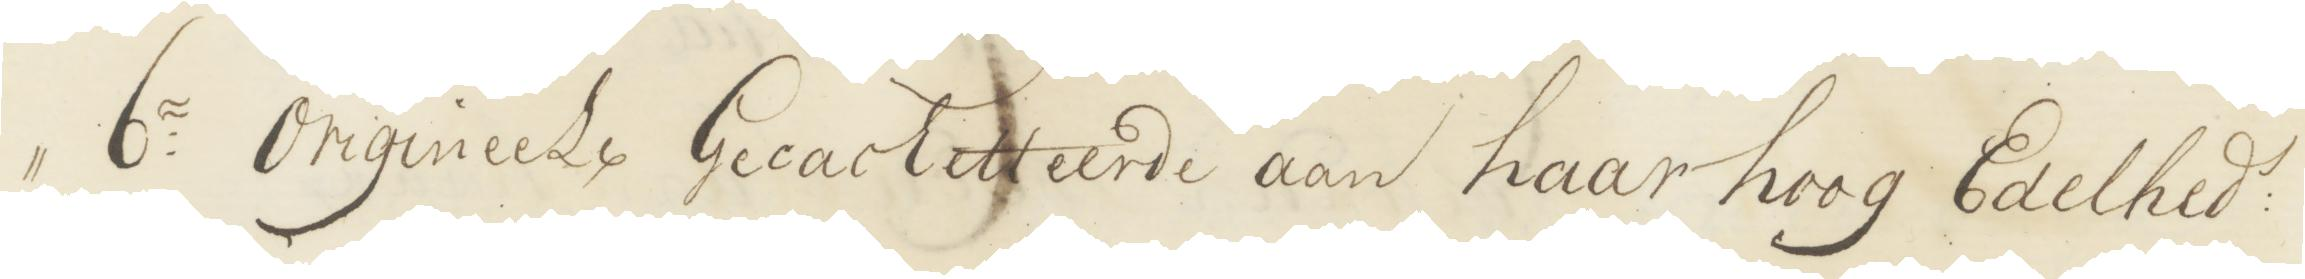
„ 6:= Origineele Gecachetteerde aan haar hoog Edelhed:s
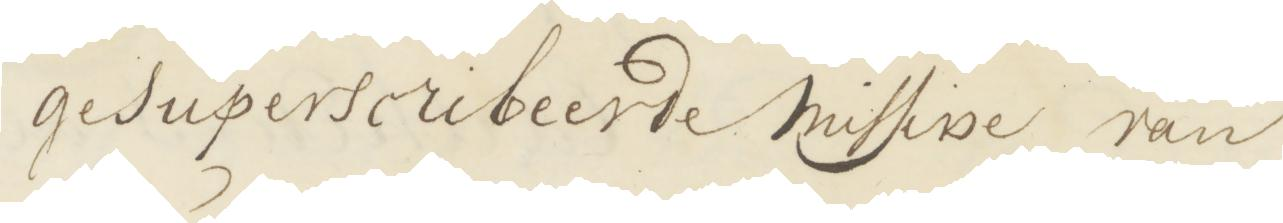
gesuperscribeerde missive van
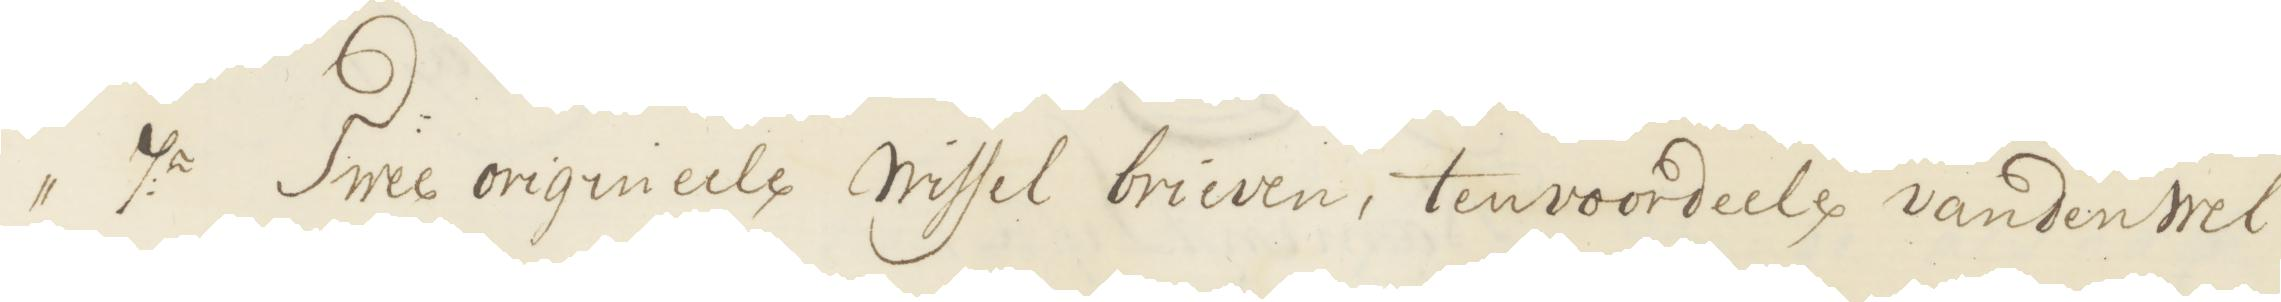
„ 7:= Twee origineele wissel brieven, ten voordeele van den wel
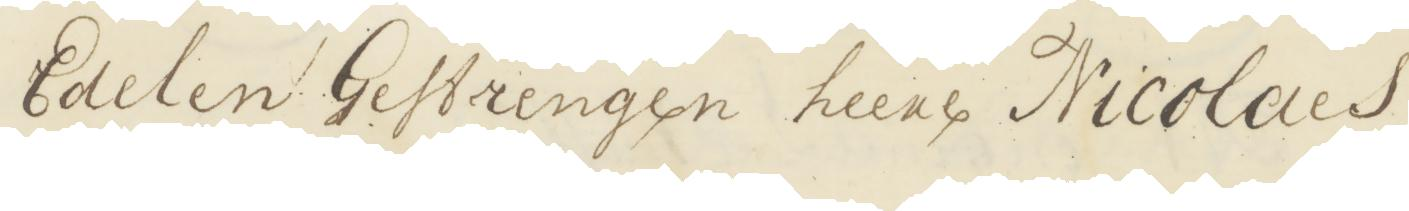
Edelen Gestrengen heere Nicolaes
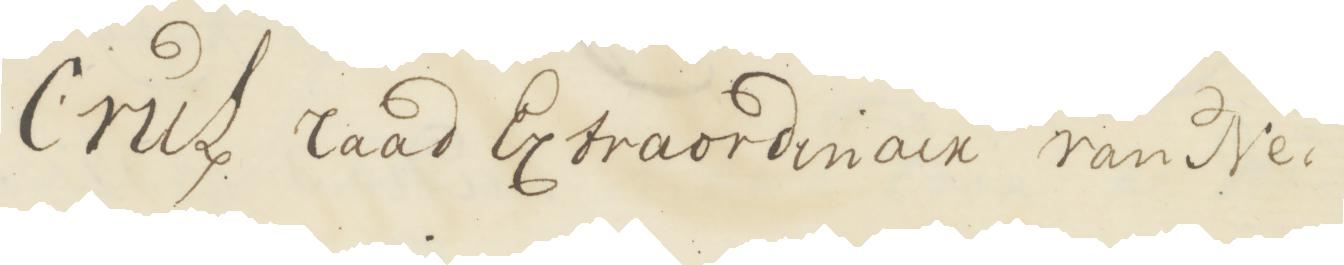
Crul raad Extraordinair van Ne„
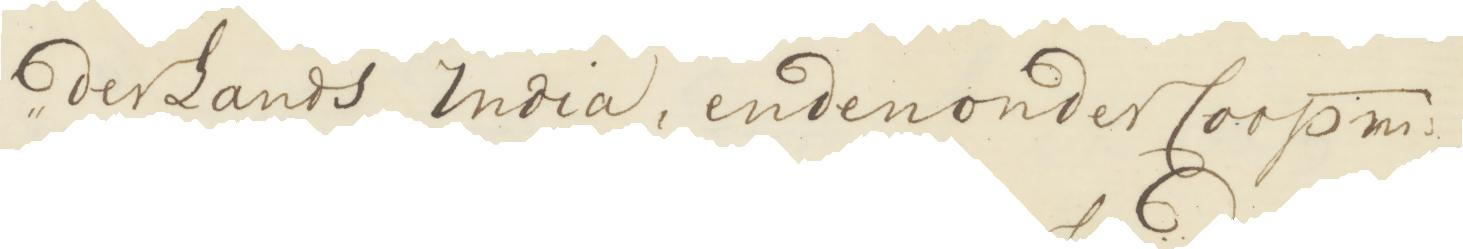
„derlands India, en den ondercoopm:
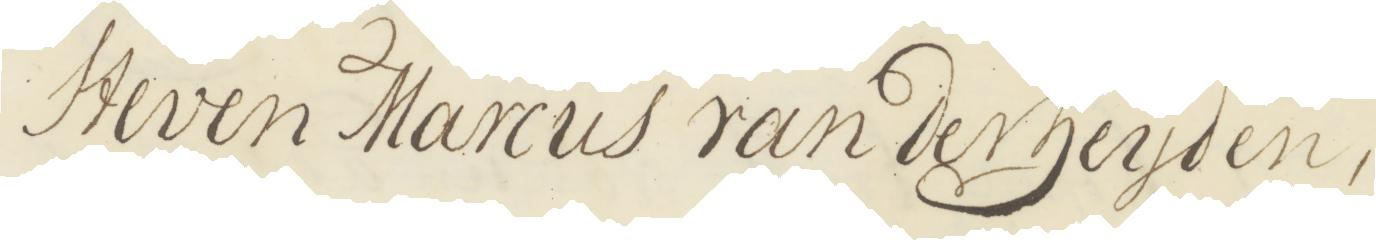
Steven Marcus van der Heijden
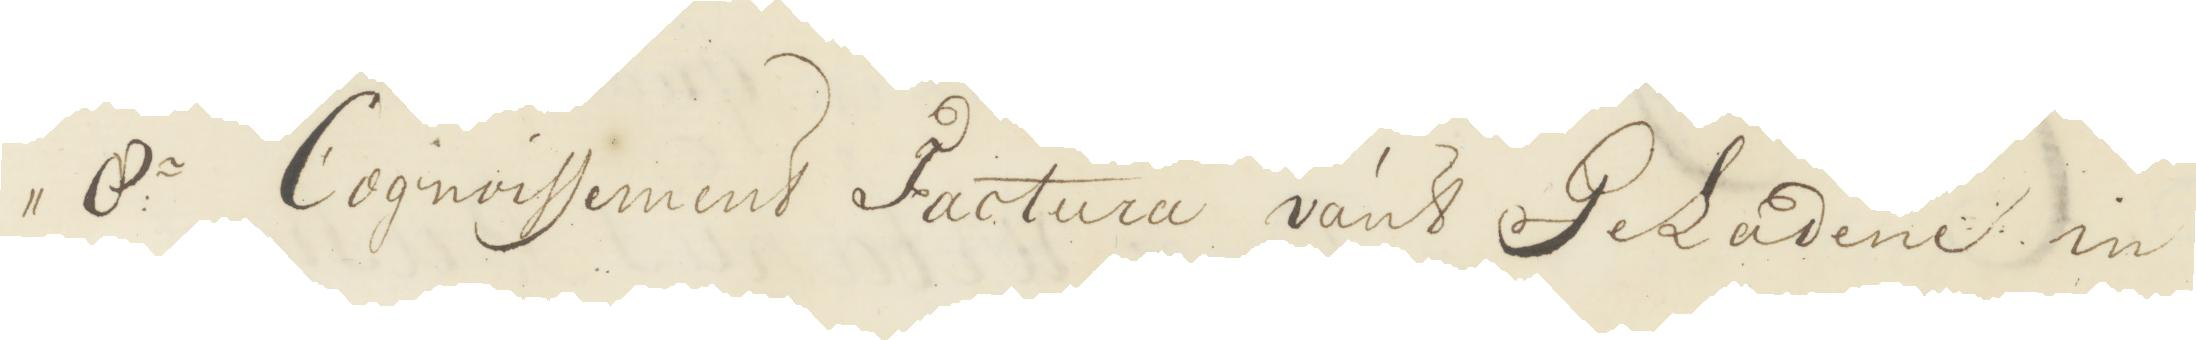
„ 8:= Cognoissement Factura van’t Geladene in
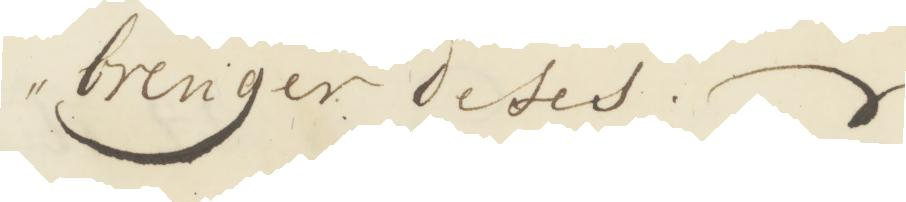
„brenger deses.
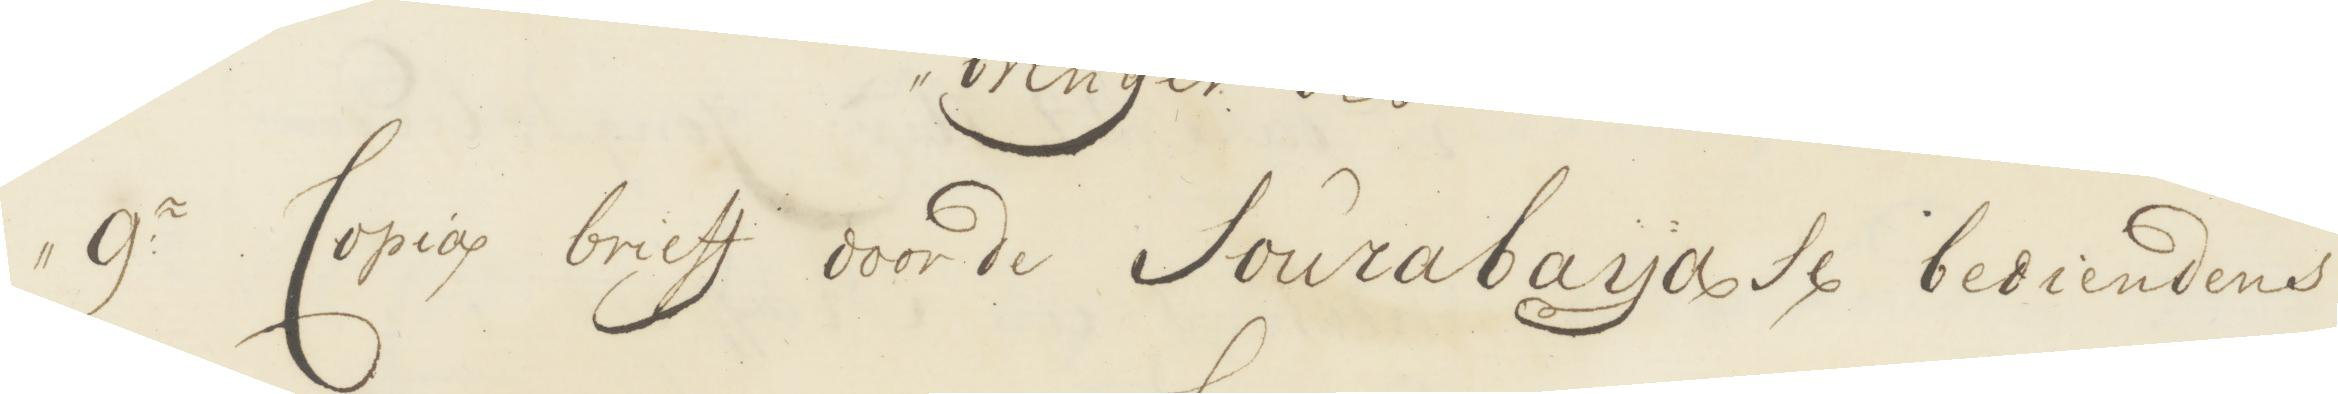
„ 9:= Copia brieff door de Sourabaijase bediendens
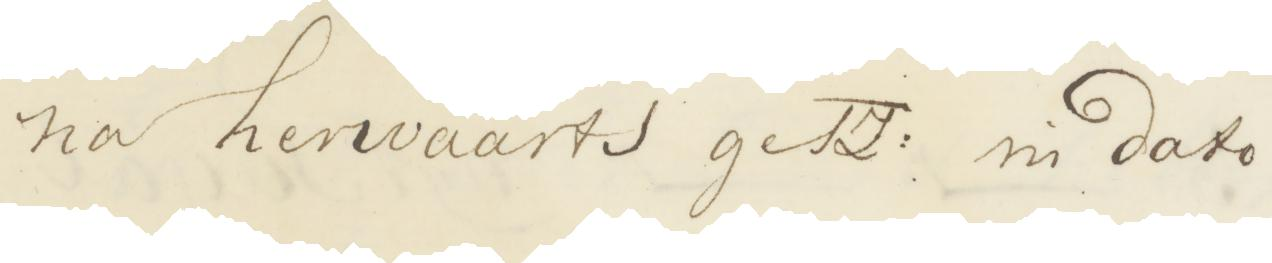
na herwaarts gesz: in dato
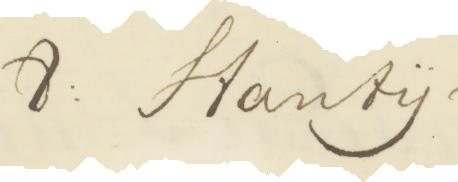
8: Stantij
